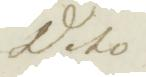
Dito . . . . . . . . .
